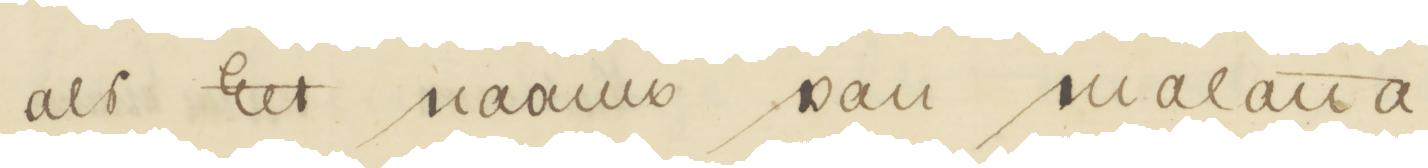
als het naauw van malacca
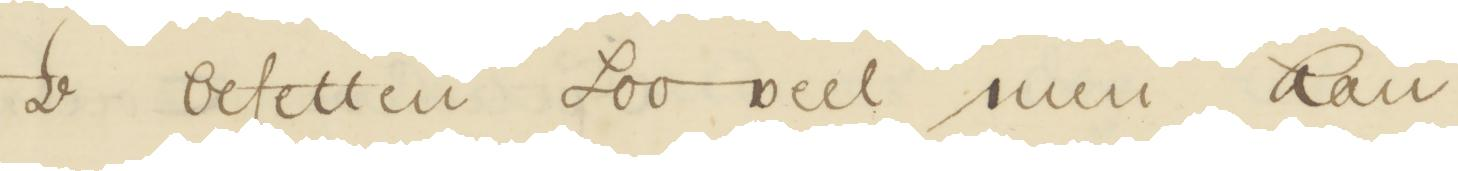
te besetten soo veel men kan
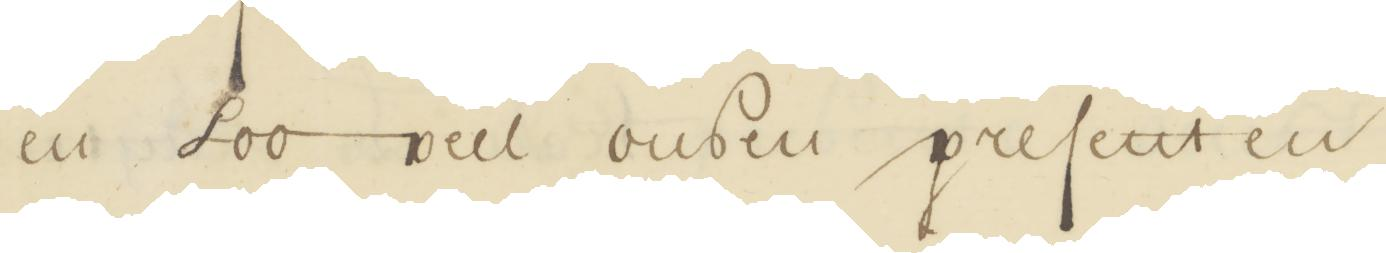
en soo veel onsen presenten
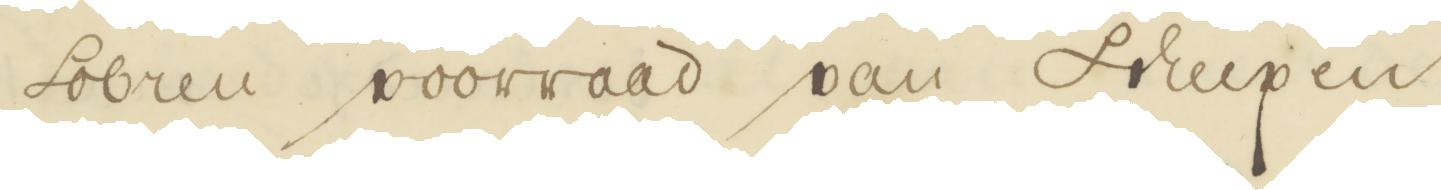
sobren voorraad van scheepen
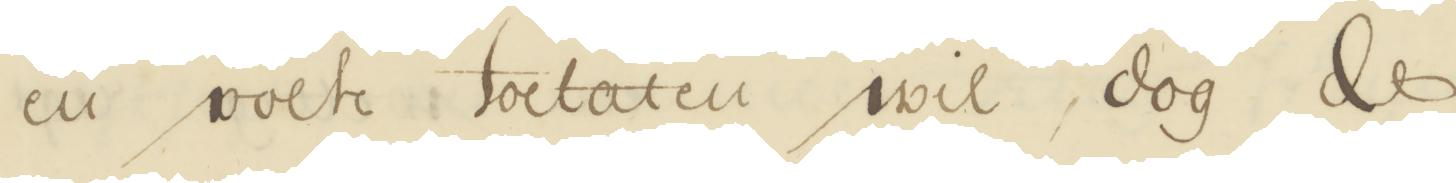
en voete toelaten wil, dog de
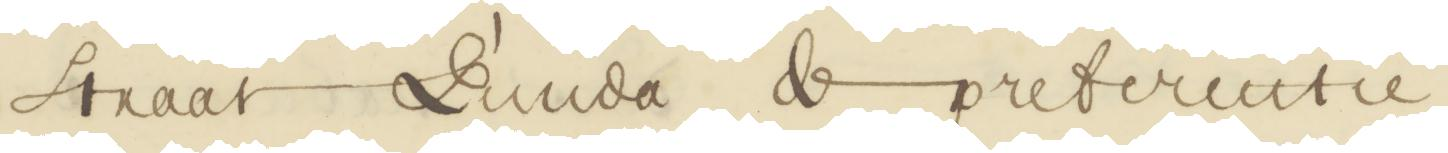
Straat Zunda de preferentie
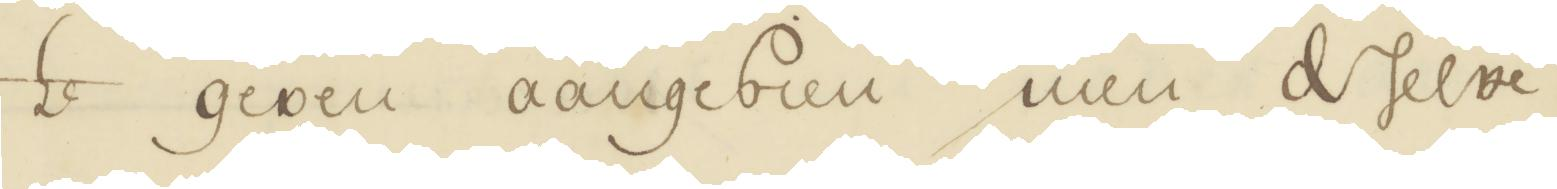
te geven aangesien men deselve
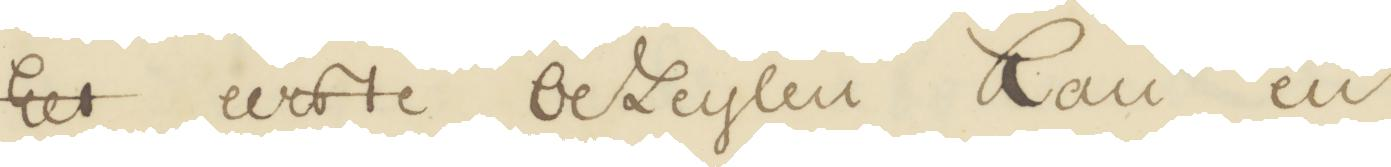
het eerste bezeijlen kan en
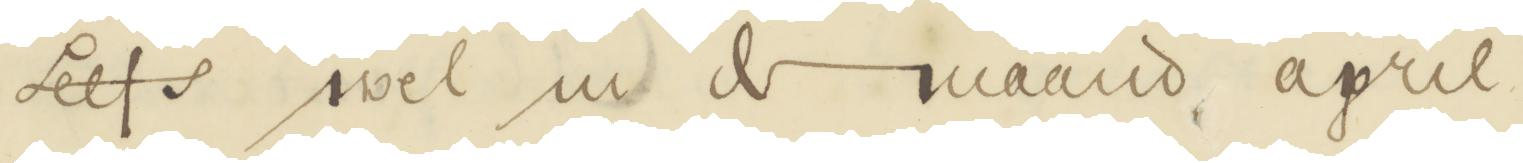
selfs wel in de maand april
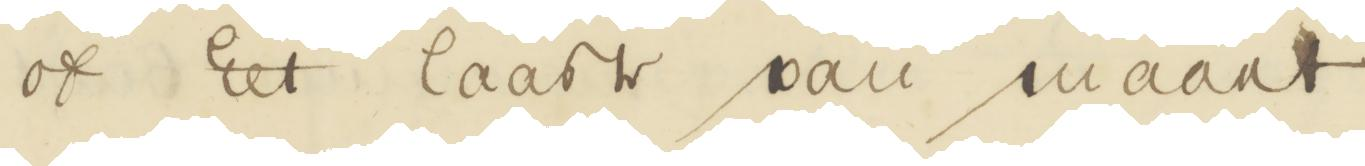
of het laaste van maart
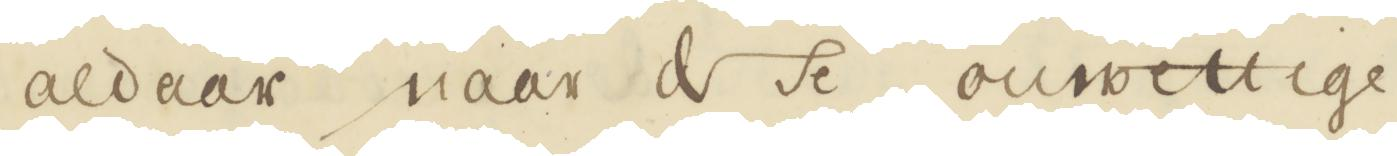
aldaar naar dese onwettige
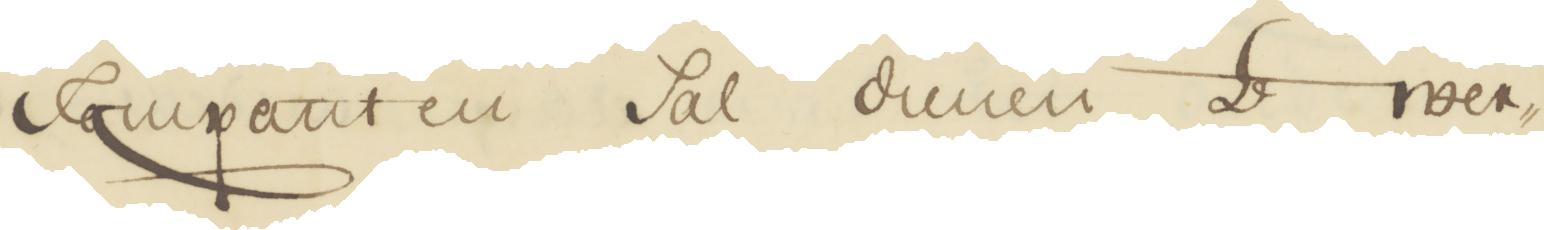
Equipanten sal dienen te wer„
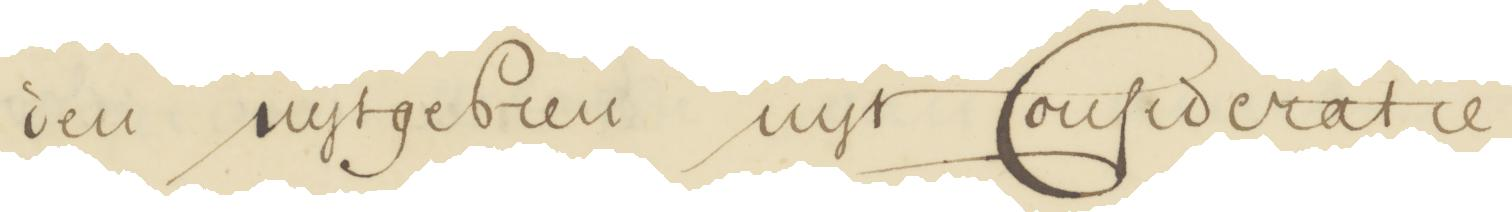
den uijtgesien uijt Consideratie
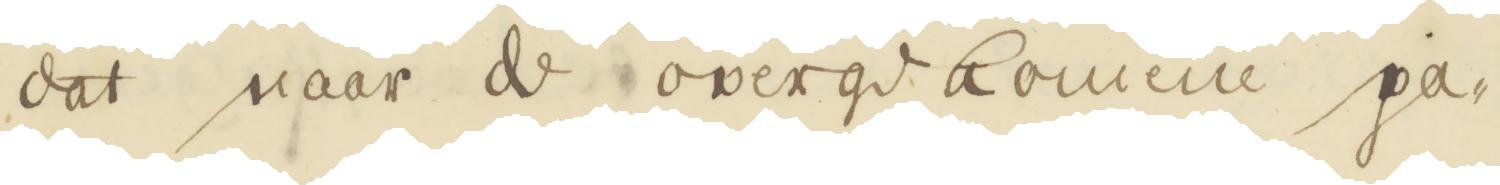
dat naar de overgekomene pa„
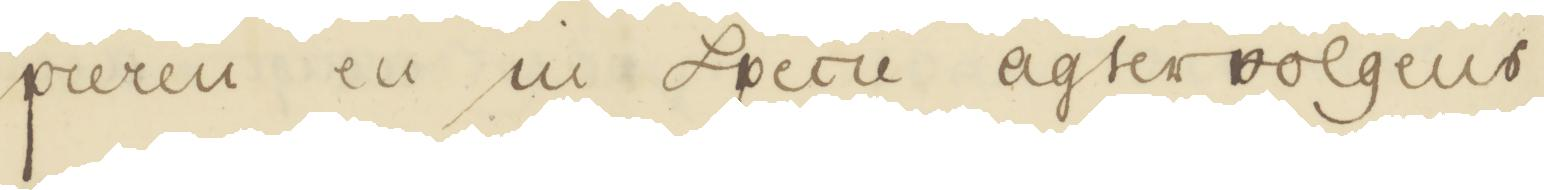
pieren en in specie agtervolgens
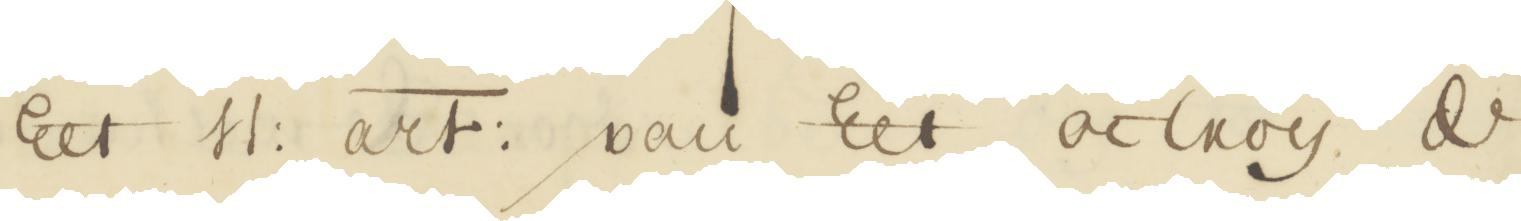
het 11: art: van het octroij de
